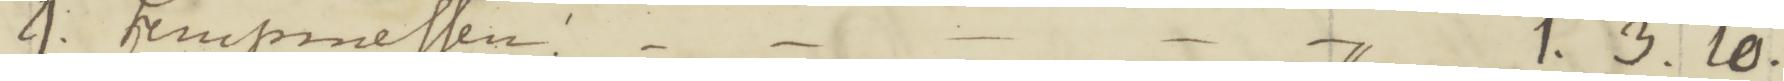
4. knipmessen - - - - - „ 1. 3. 10.
